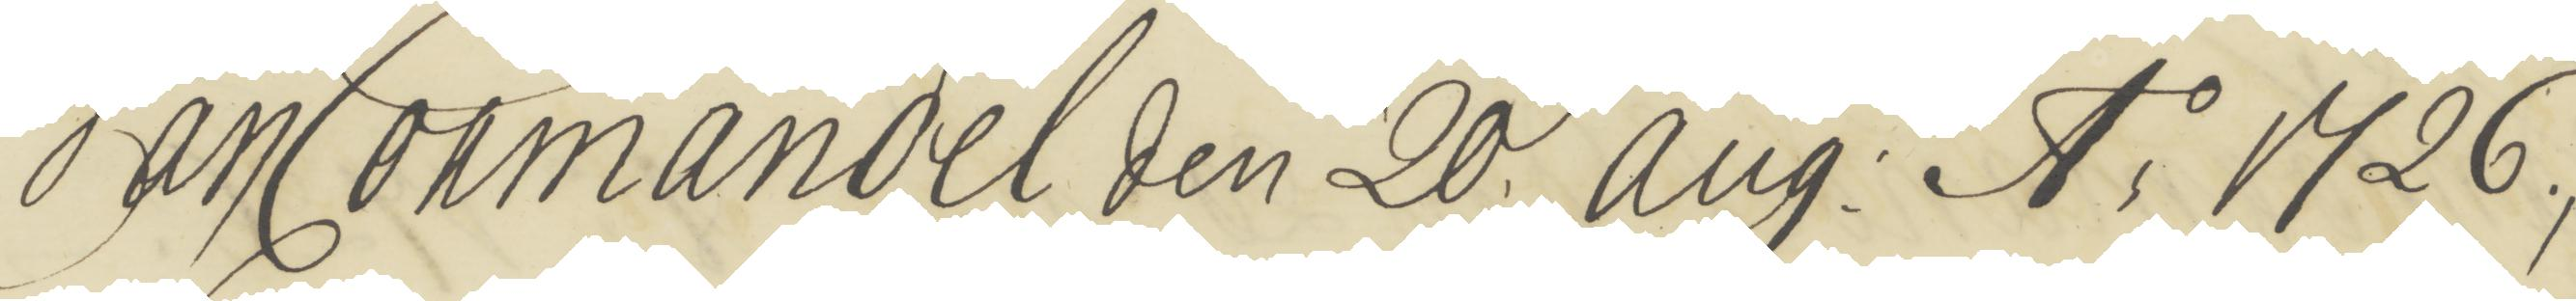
Van Cormandel den 20: Aug: A„o 1726.
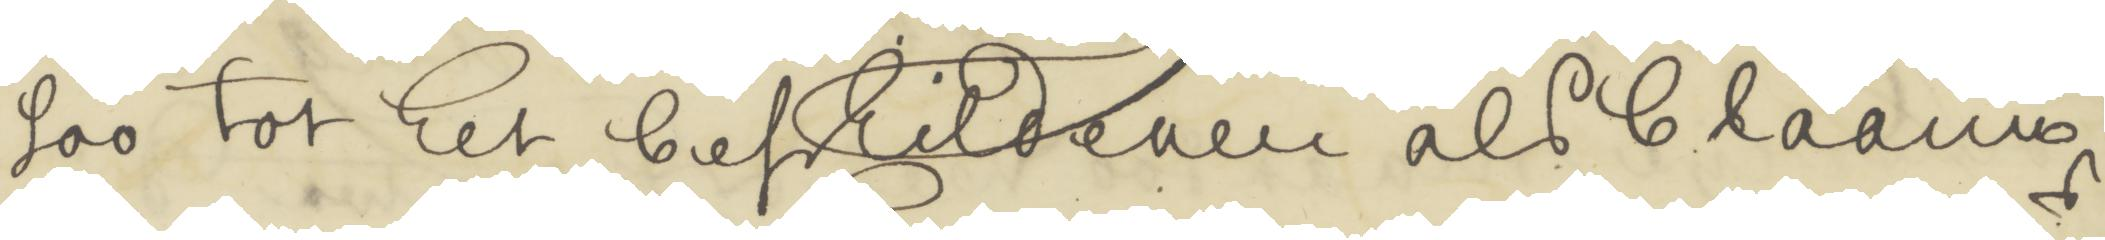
soo tot het beschilderen als blaauw
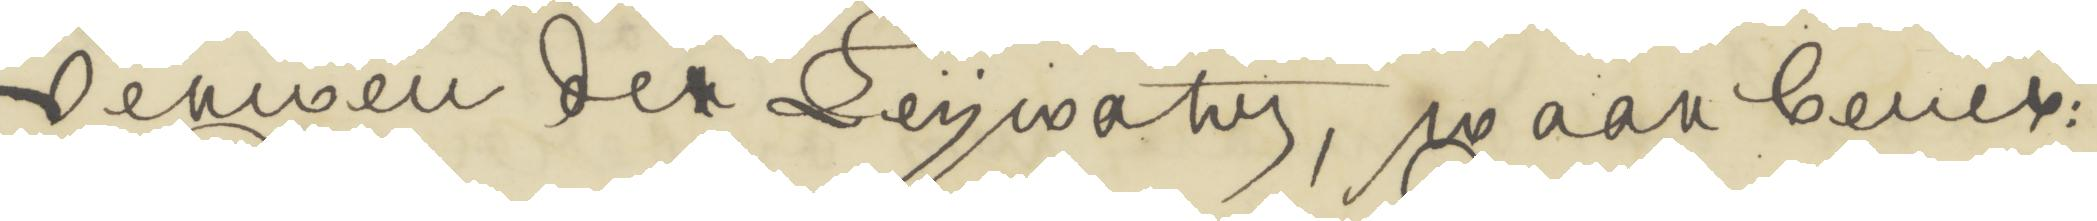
verwen der Leijwaten, waar benev:s
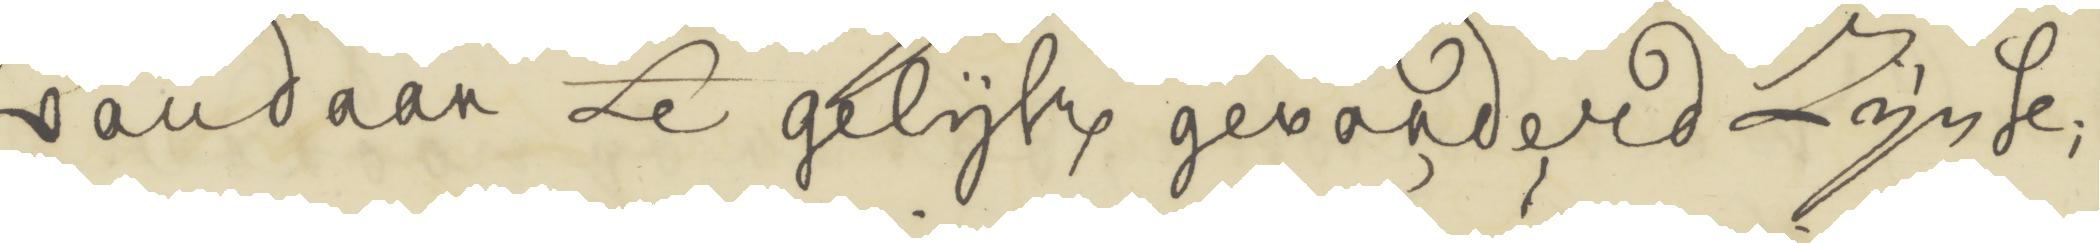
vandaar te gelijk gevorderd zijn se„
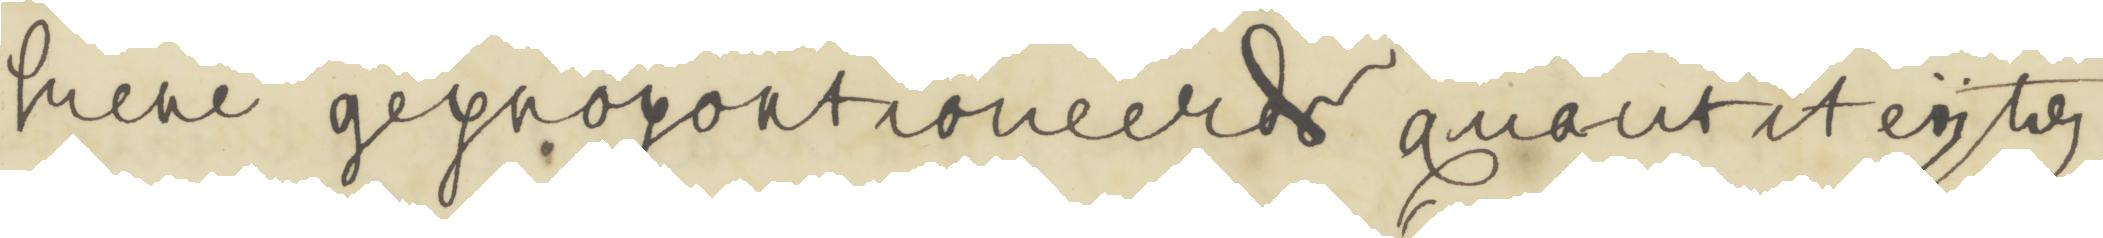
kere geproportioneerde quantiteijten
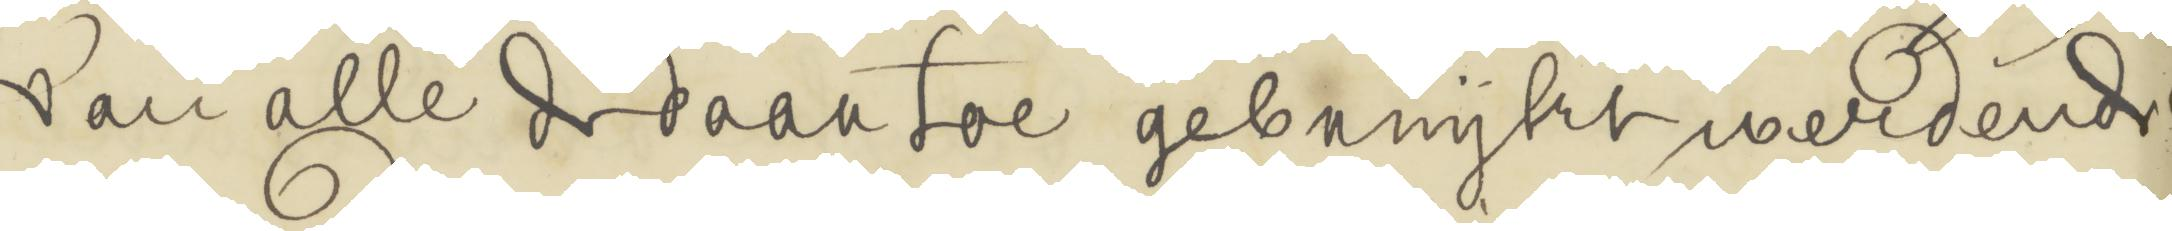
van alle de daar toe gebruijkt werdende
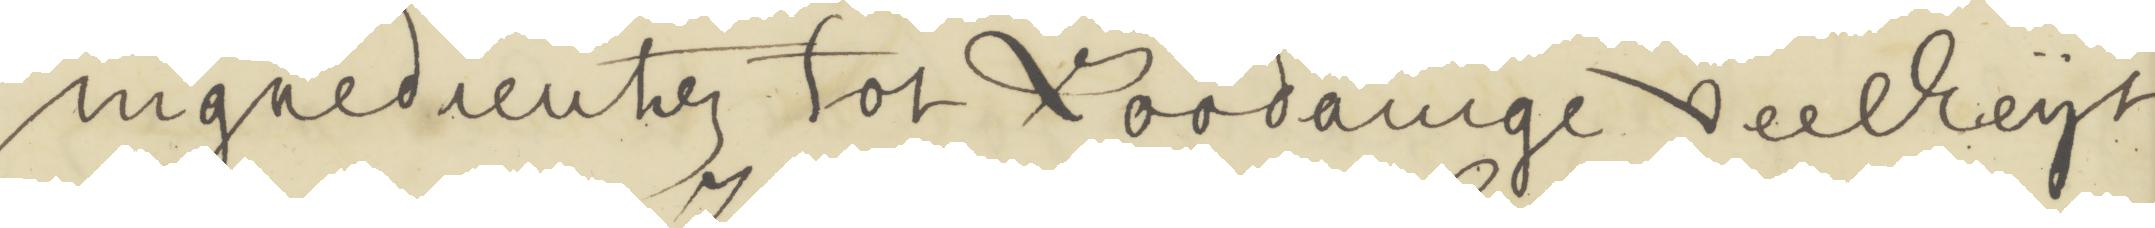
ingredienten tot zoodanige veelheijt
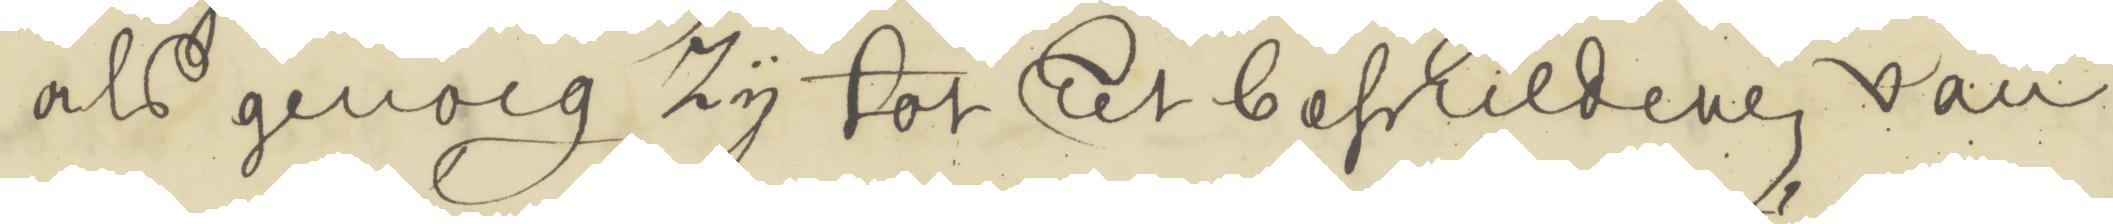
als genoeg zij tot het beschilderen van
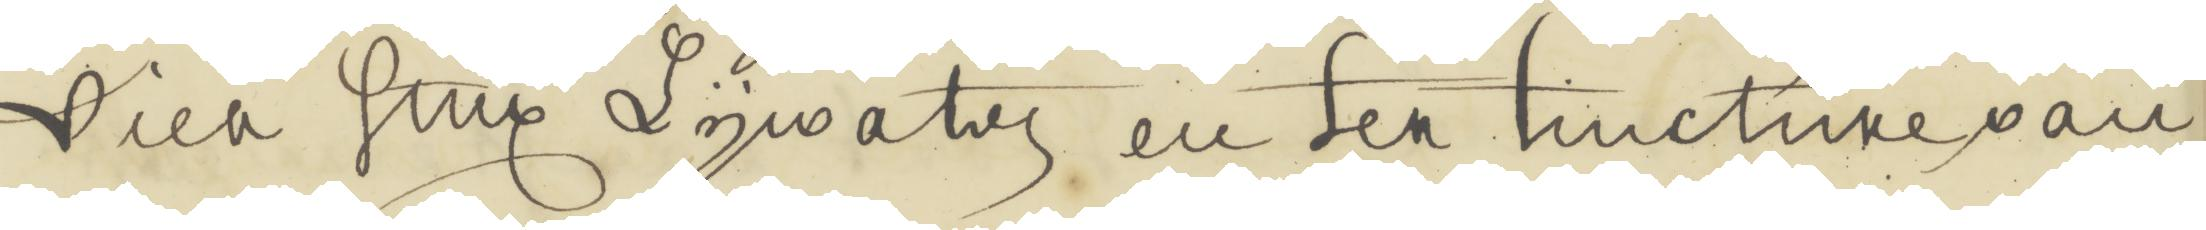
Vier stux Lijwaten en ter tincture van
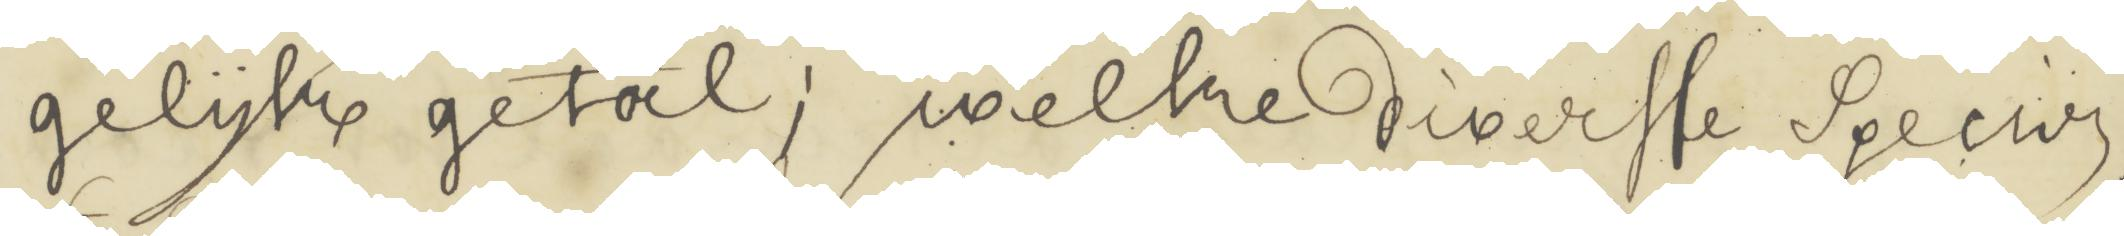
gelijk getal; welke diversse specien
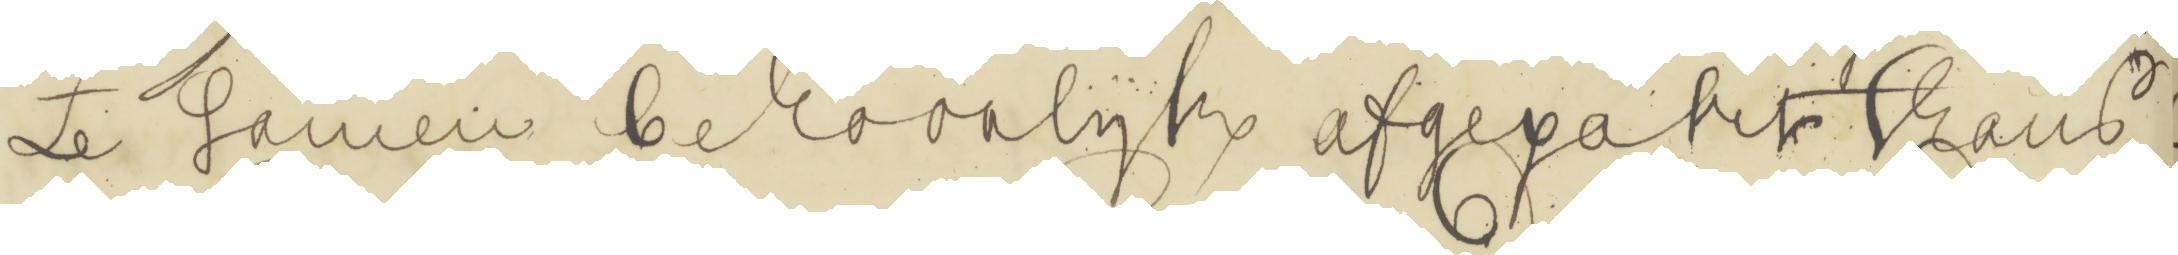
te samen behoorlijk afgepakt thans
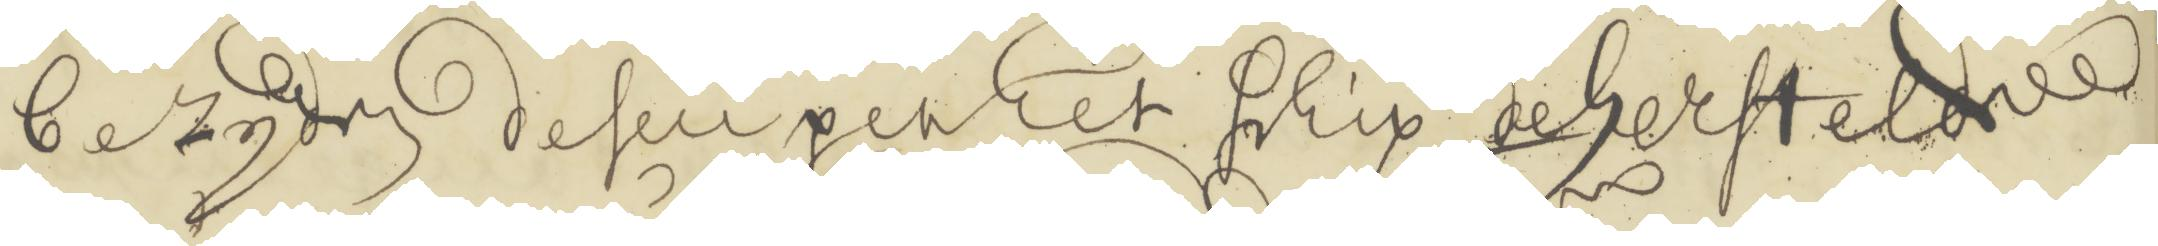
bezijden desen per het schip de herstelde
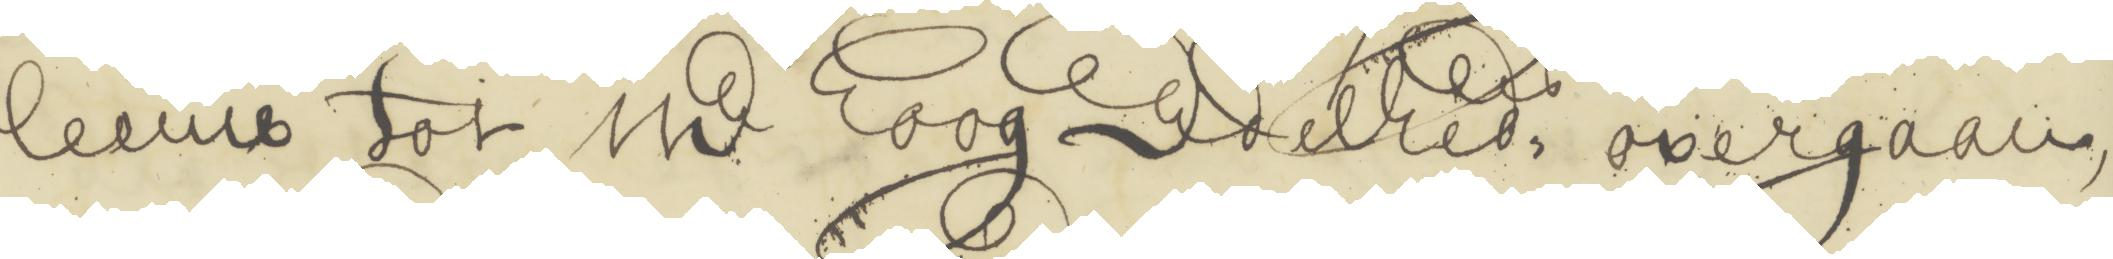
leeuw tot UE hoog Edelhed:s overgaan,
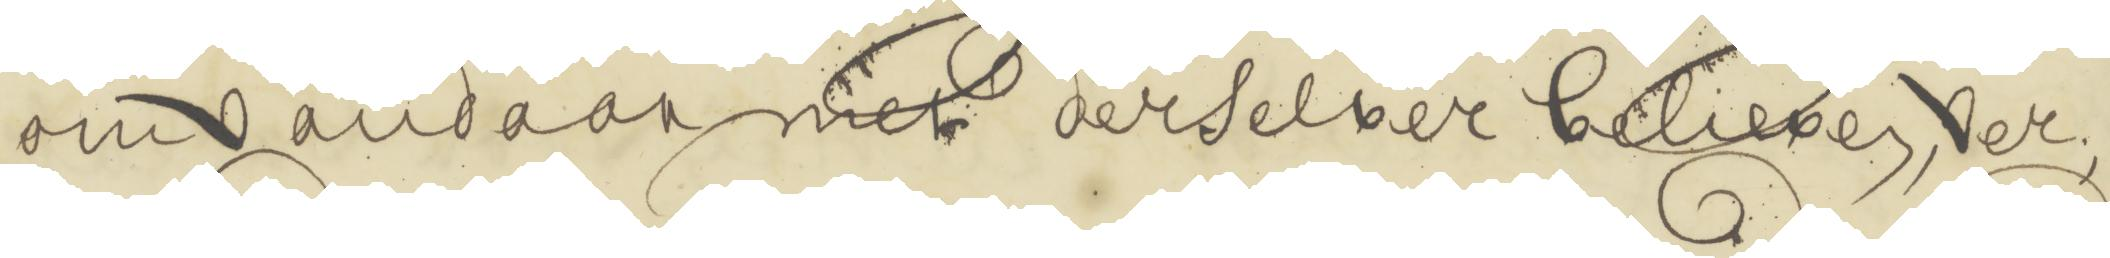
om vandaar met derselver believen, ver„
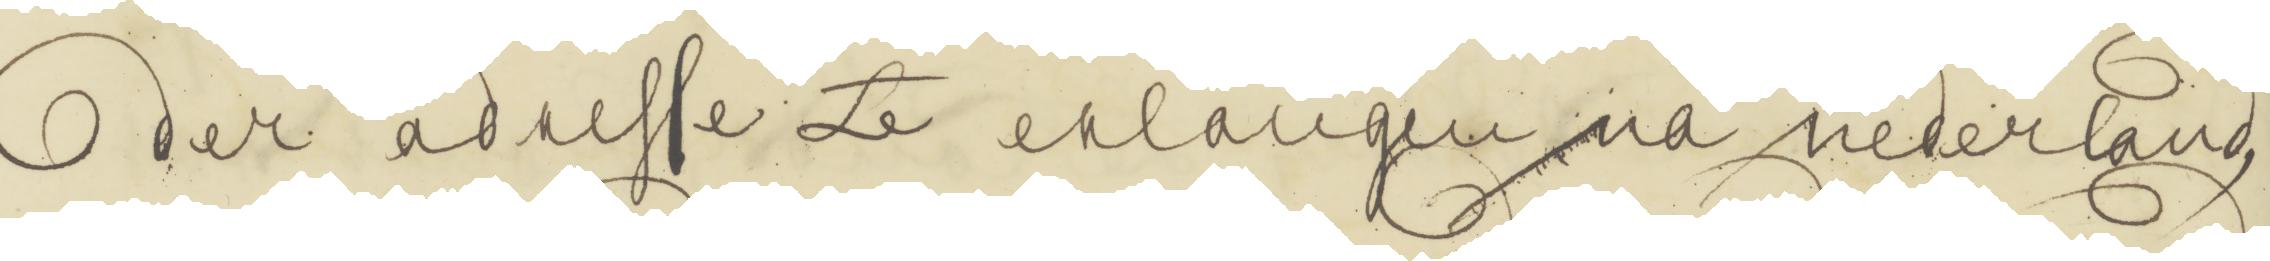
der adresse te erlangen na nederland,
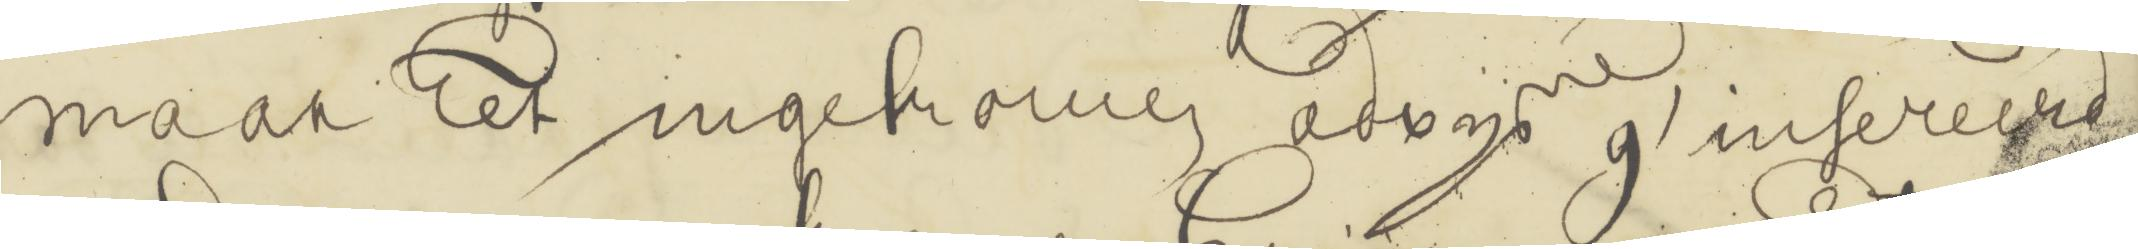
maar het ingekomen advijs g’insereerd
